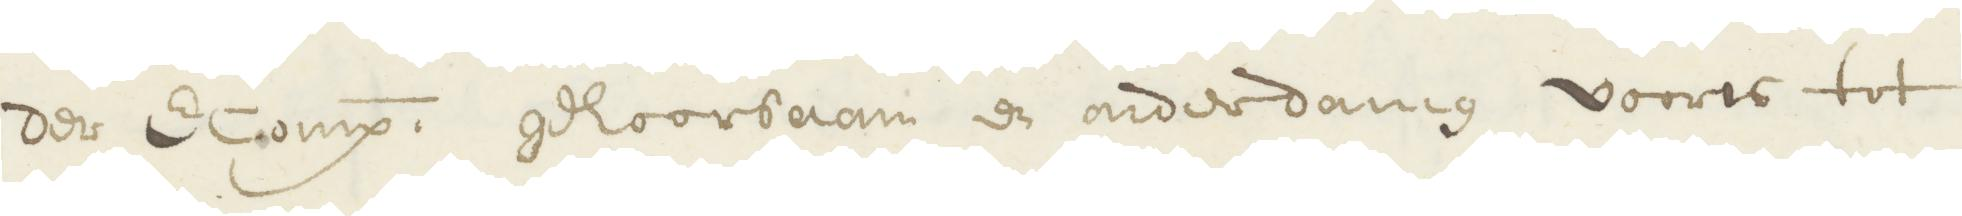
der EComp. gehoorsaam en onderdanig voorts tot
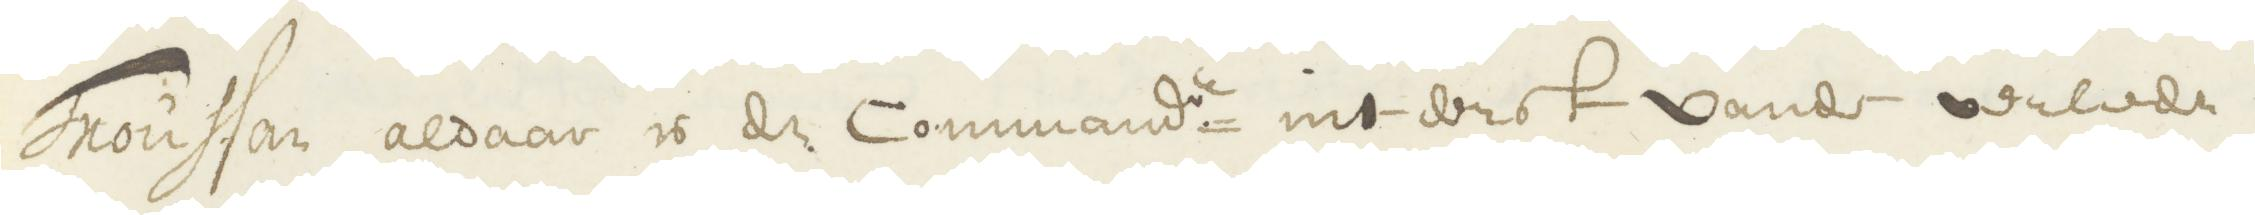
Troussan aldaar is den Command=r int eerst vande verleden
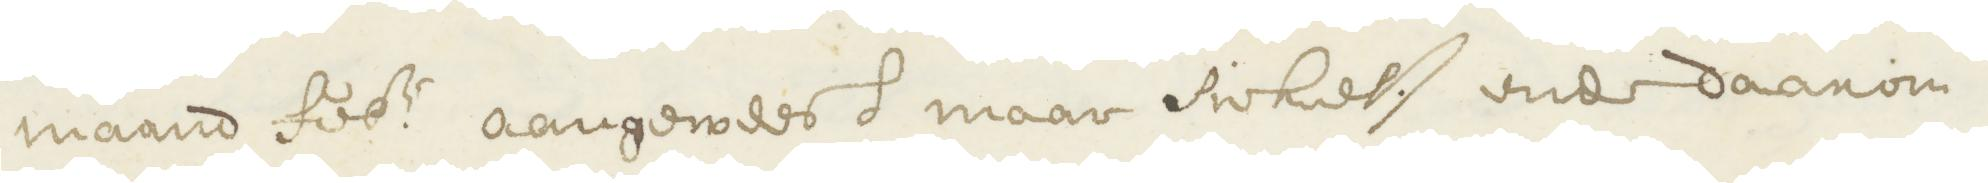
maand feb:r aangeweest maar siekelijk ende daarom
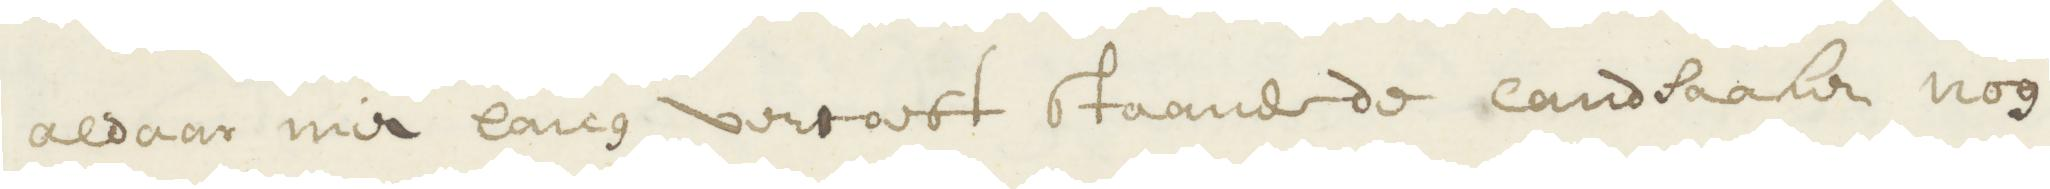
aldaar niet lang vertoeft staande de candsaaken nog
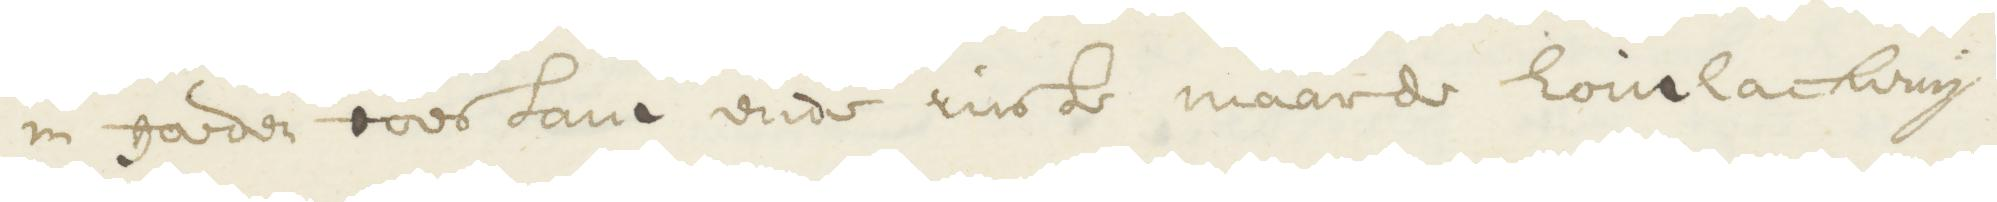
in goeden toestant ende ruste maar de houthackerij
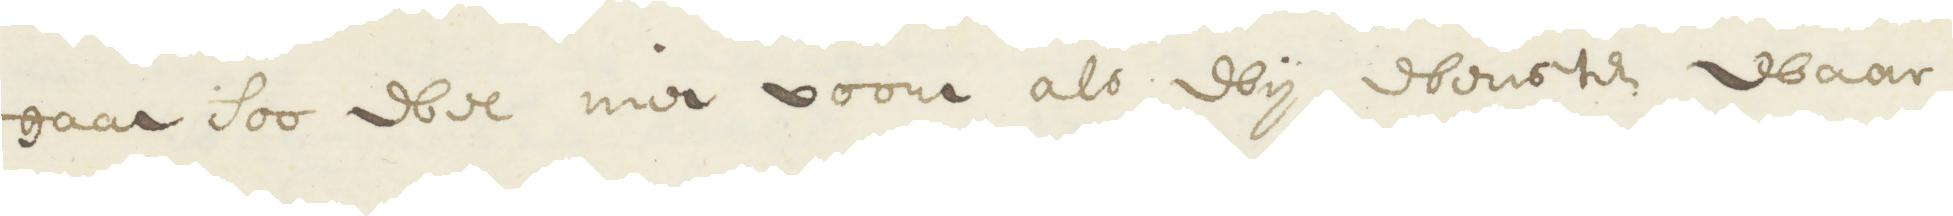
gaat soo wel niet voort als wij wensten waar
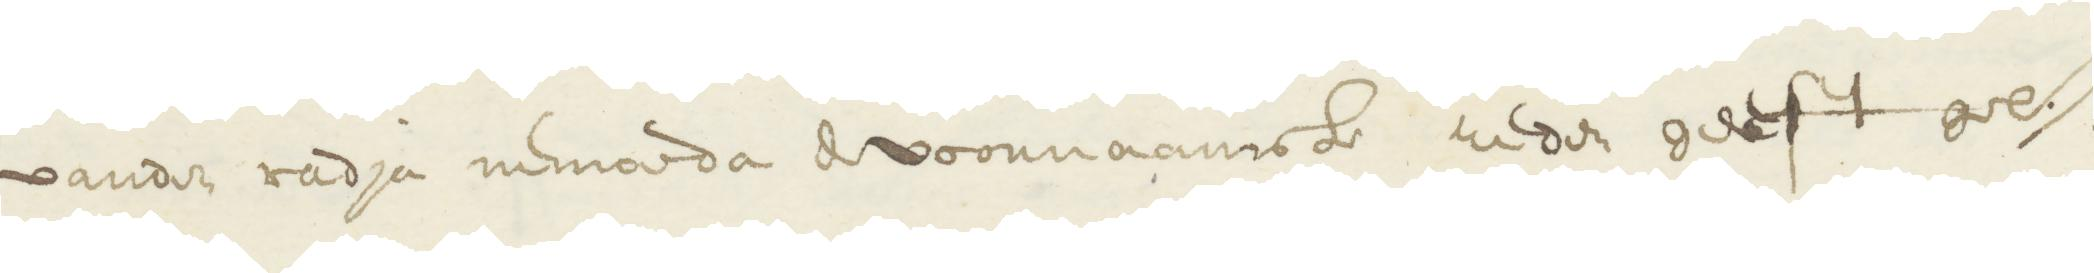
vanden radja nemoeda dvoornaamste reden geeft gelijk
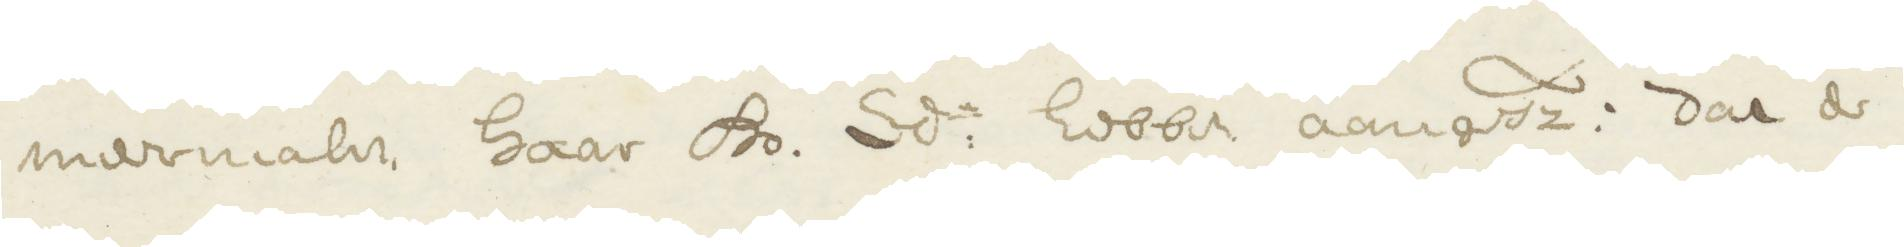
meermalen haar Ho. Ed:er hebben aan gesz: dat de
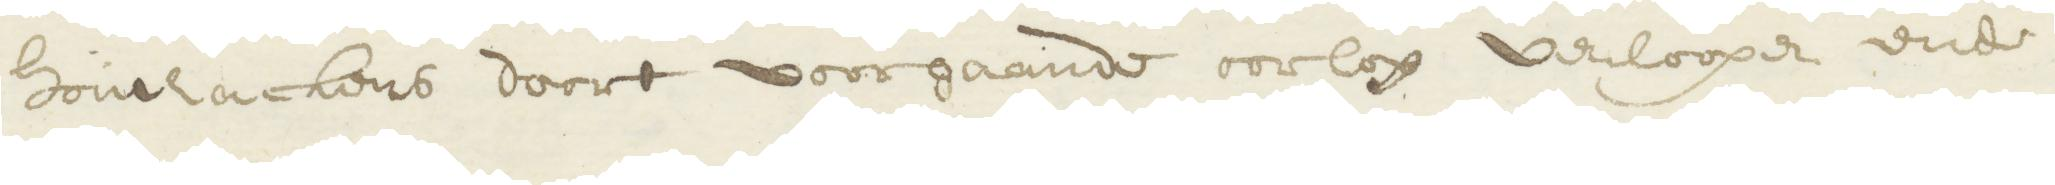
houthackers doort voorgaande oorlof verloopen ende
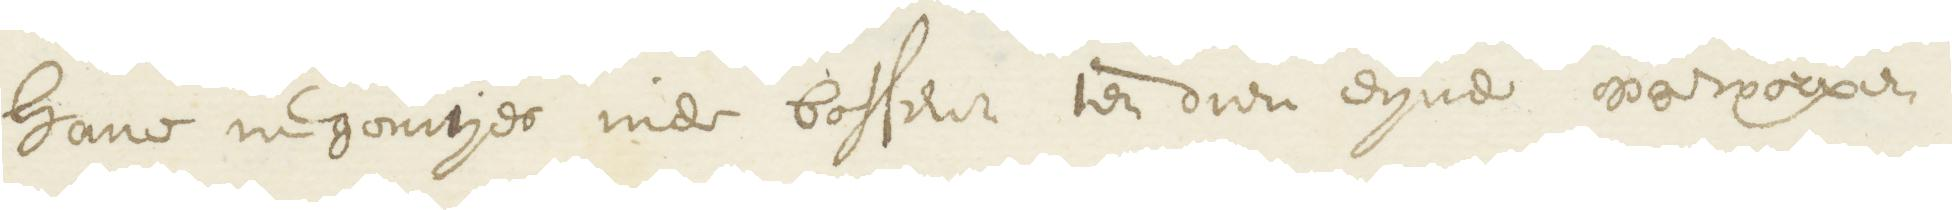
hare negoritjes inde bosschen ten dien eijnde opgeworpen
